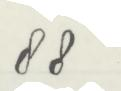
885
